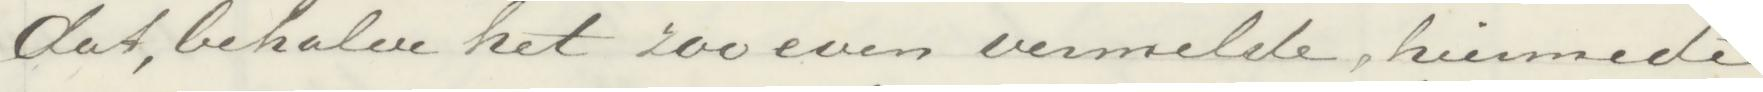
dat, behalve het zoo even vermelde, hiermede
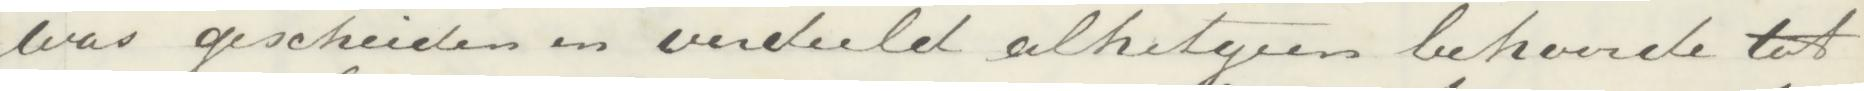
was gescheiden en verdeeld alhetgeen behoorde tot
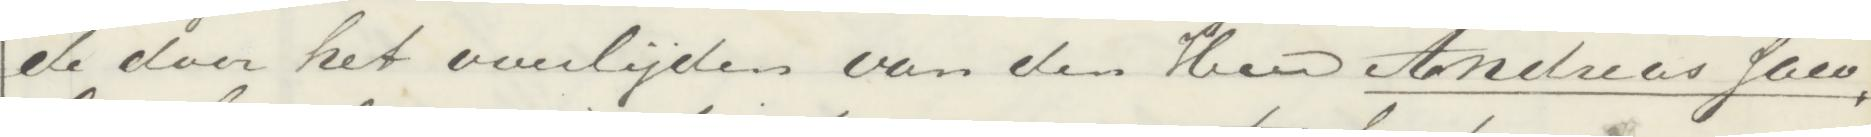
de door het overlijden van den Heer Andreas Jaco„
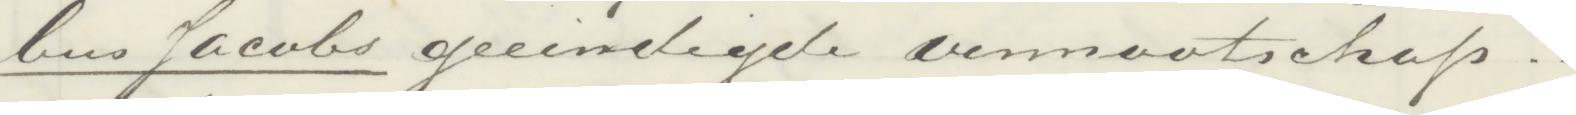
bus Jacobs geeindigde vennootschap.
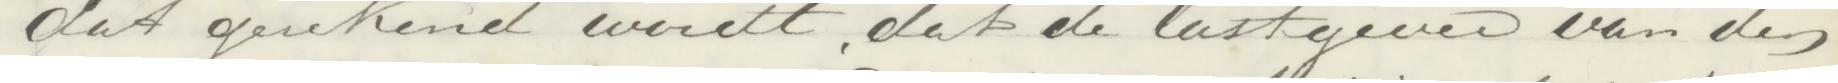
dat gerekend wordt, dat de lastgever van den
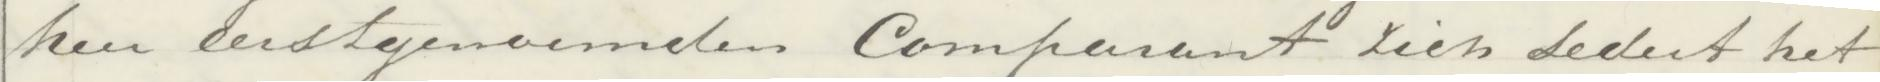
hier eerstgenoemden Comparant zich sedert het
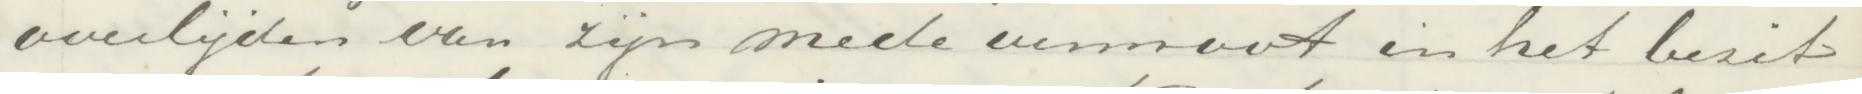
overlijden van zijn mede vennoot in het bezit
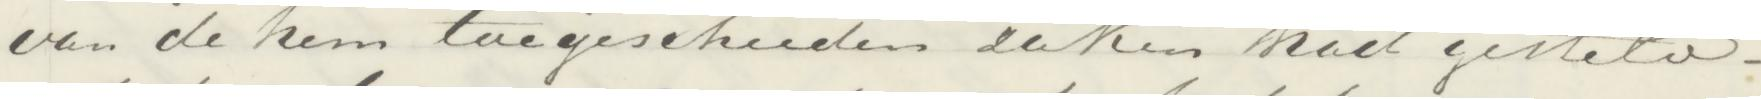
van de hem toegescheiden zaken had gesteld-
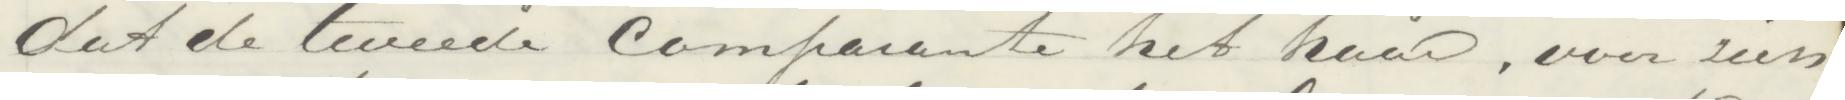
dat de tweede Comparante het haar, voor zich
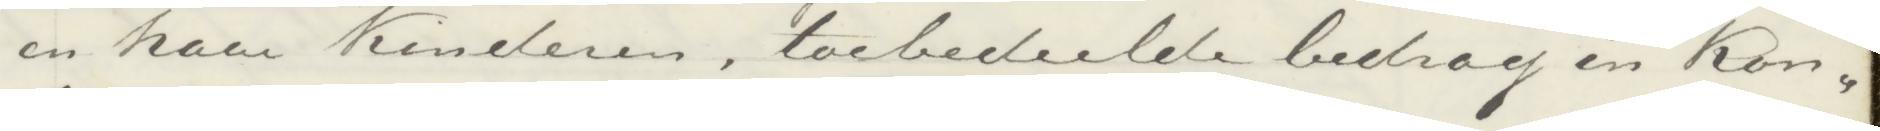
en haar kinderen, toebedeelde bedrag in kon„
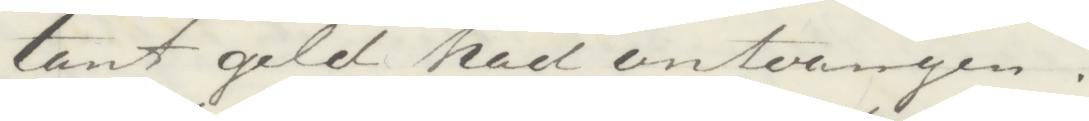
tant geld had ontvangen.
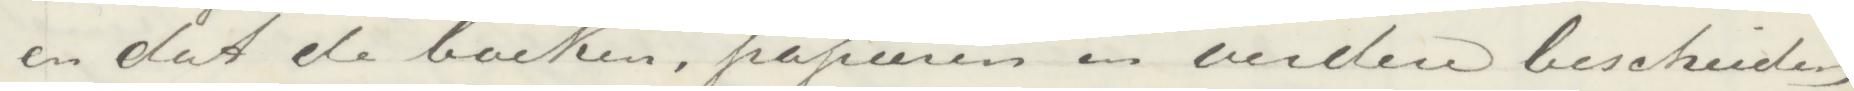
en dat de boeken, papieren en verdere bescheiden
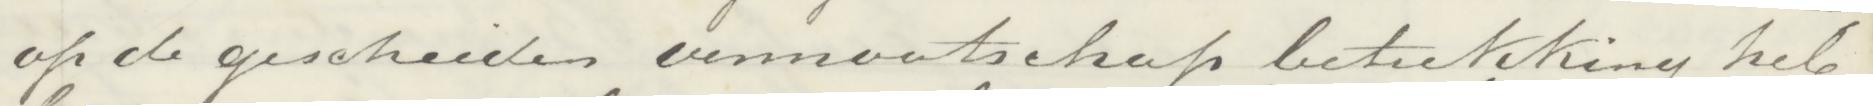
op de gescheiden venootschap betekking heb
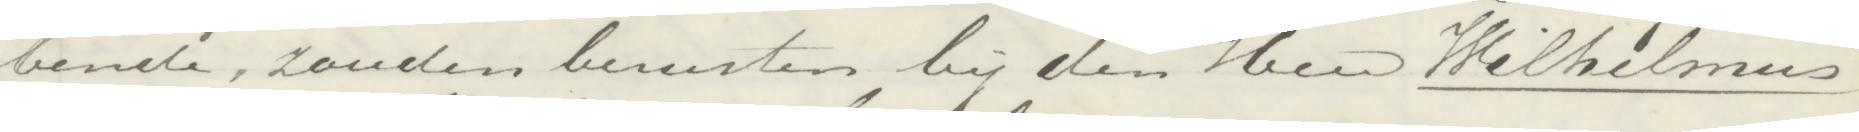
bende, zouden berusten bij den Heer Wilhelmus
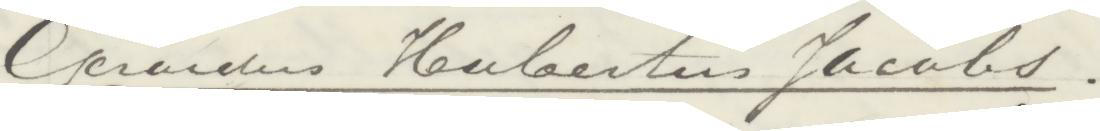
Gerardus Hubertus Jacobs.
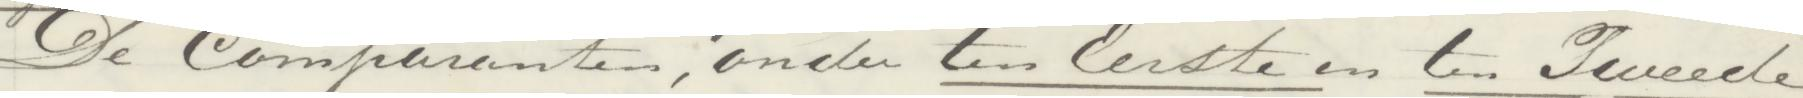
De Comparanten, onder ten Eerste en ten Tweede
